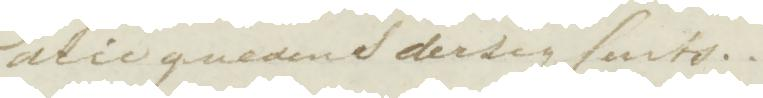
drie guldens dertig Cents. . . .
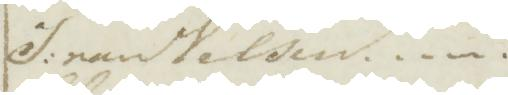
J: van Velsen. . . . .
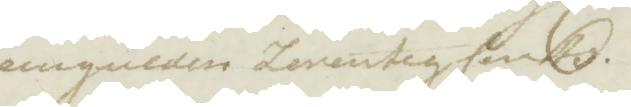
een gulden Zeventig Cents. . . . . . .
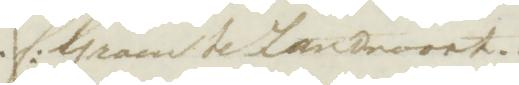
C: Graan te Zandvoort. .
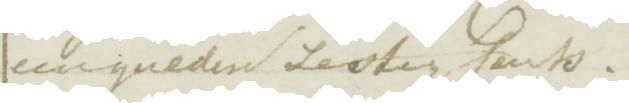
een gulden Zestien Cents. . . . . . . .
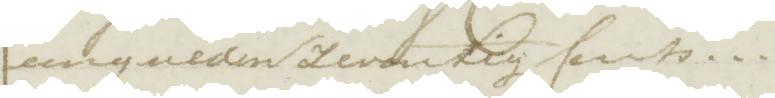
een gulden zeventig Cents . . . . .
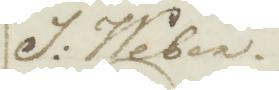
J: Weber. . . . . . . .
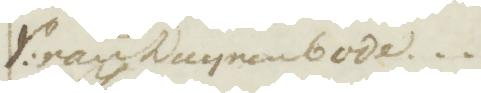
V. van Duyvenbode . . . . .
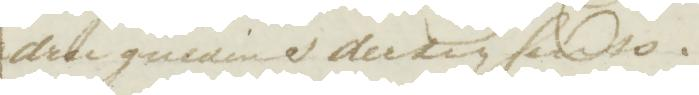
drie guldens dertig Cents. . . . .
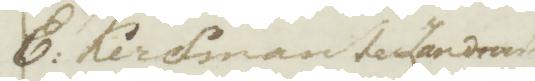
E: Kersman te Zandvoort
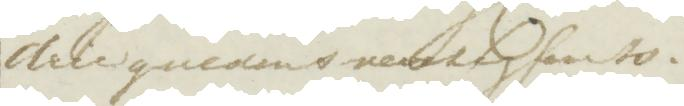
drie guldens veertig Cents. . . . .
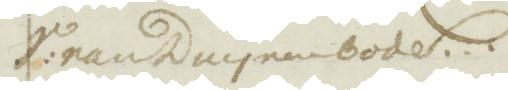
V: van Duijvenbode. . . .
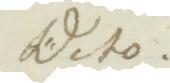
Dito. . . . . .
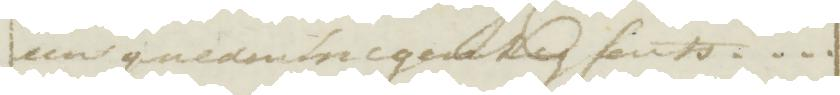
een gulden negentig Cents . . . .
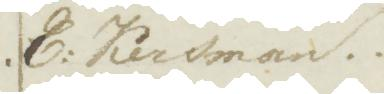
E: Kersman. . . . . . .
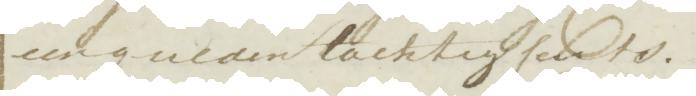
een gulden tachtig Cents. . . . .
